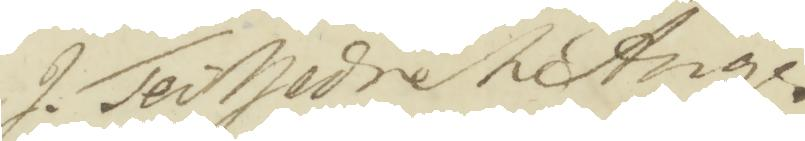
J. Teissedre L'Ange.
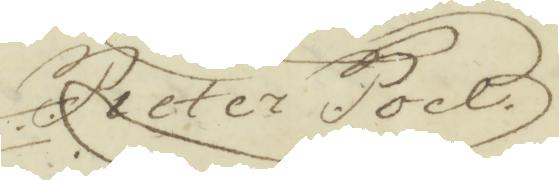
Pieter Poel.
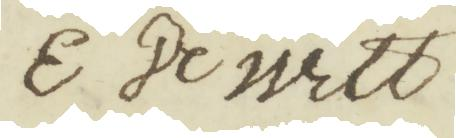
E De Witt
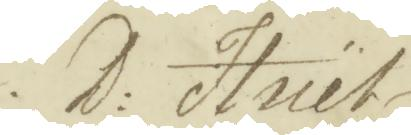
C: D: Huët
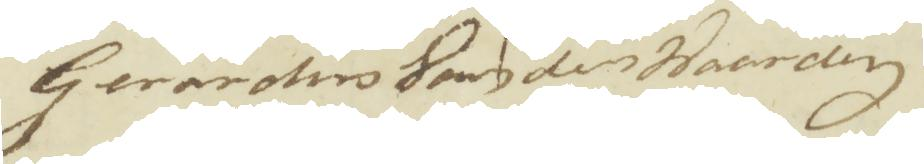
Gerardes van der Waarden
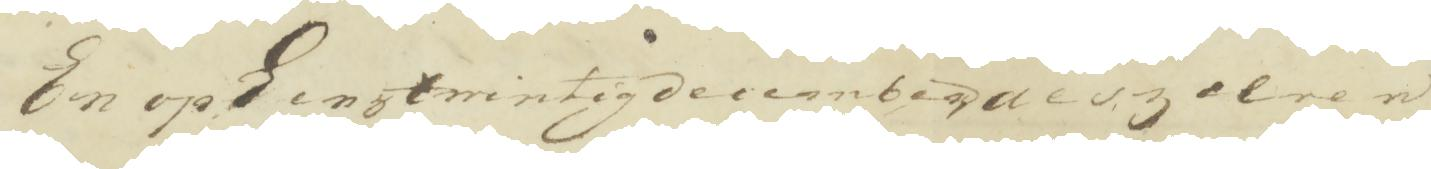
En op Een en twintig december des, zelven
